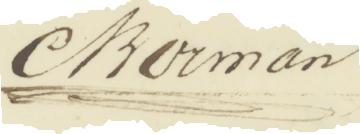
J C Borman
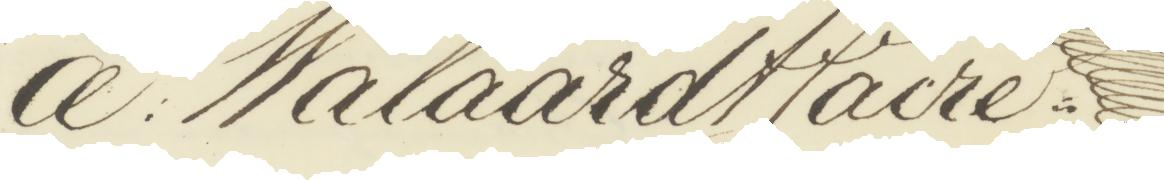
Ae: Walaardt Sacré =
